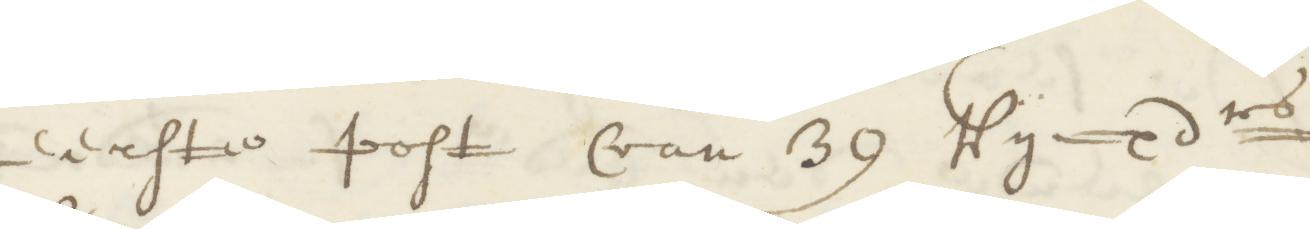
D' eerste post van 39 Rijcxd=rs
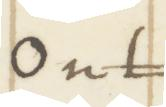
Ont
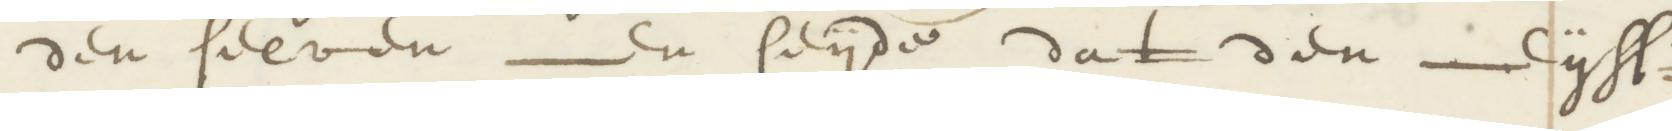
der selven en seijde dat den eijss=r
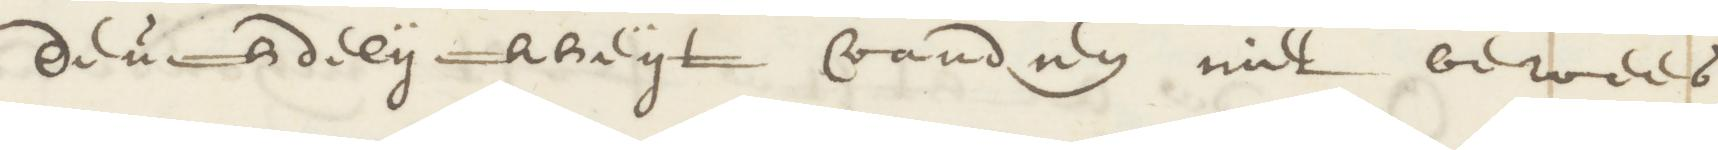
de u edelijckheijt vandien niet bewees
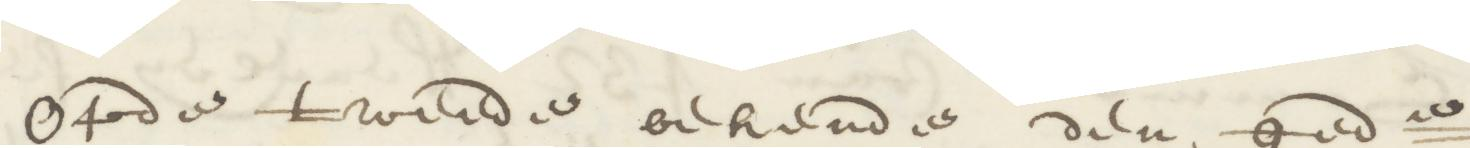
Opde tweede bekende den ged=e
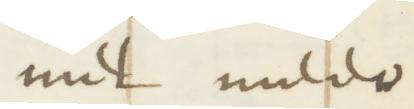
niet meer
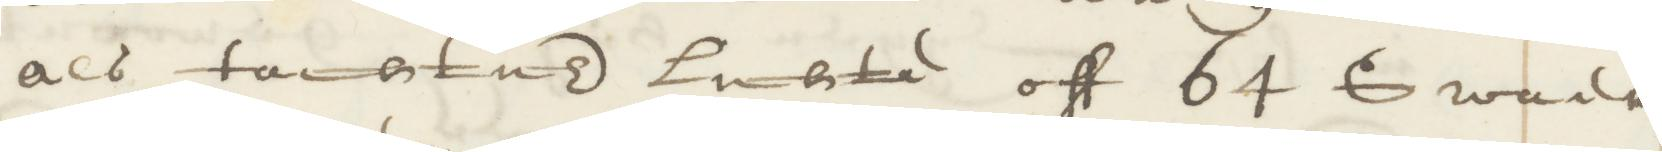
als tachtich Lichte off 64 Swaere realen
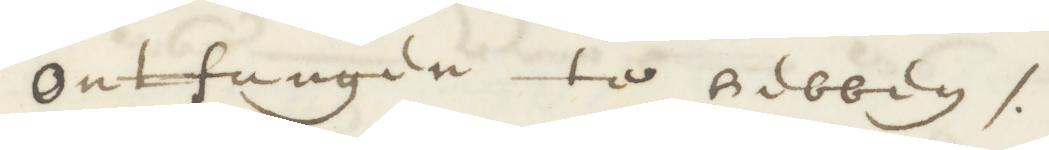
ontfangen te hebben/.
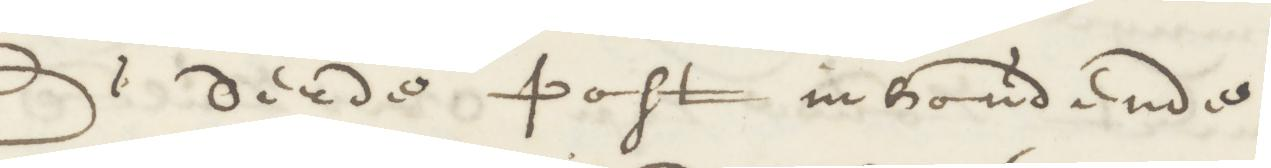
De derde post in houdende
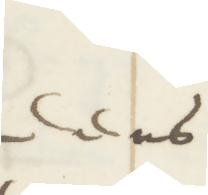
Eens
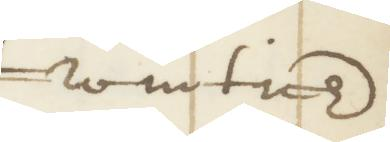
twintich
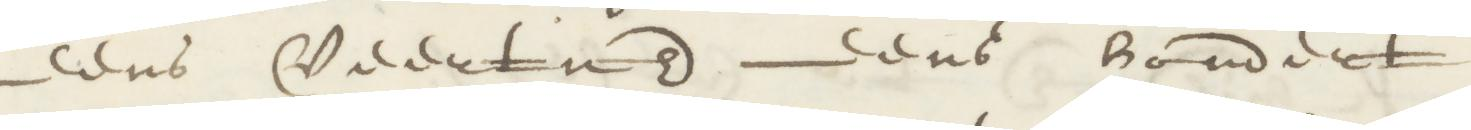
eens Veertich eens hondert
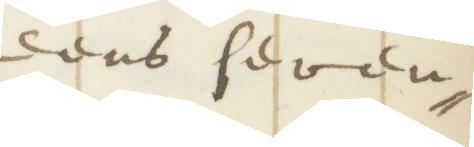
eens seven„
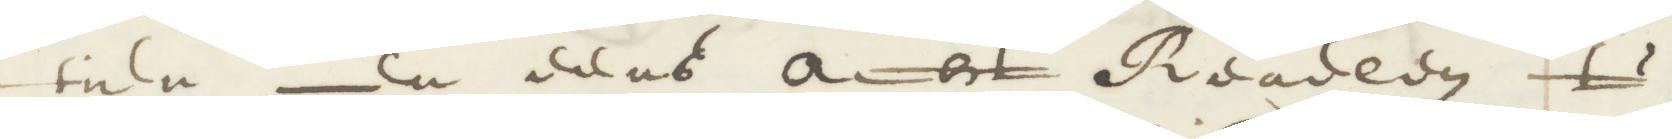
tien en eens acht Reaelen te
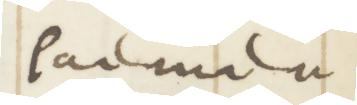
saemen
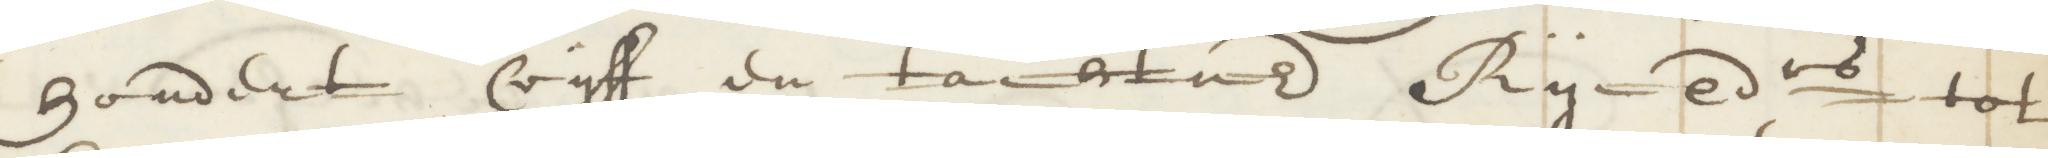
hondert vijff en tachtich Rijcxd=rs tot
